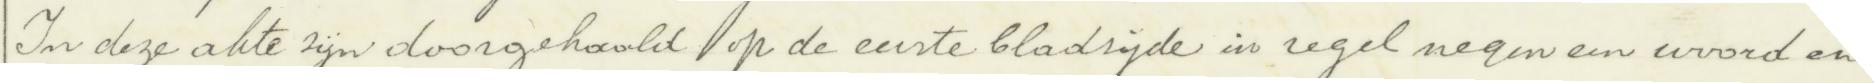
In deze akte zijn doorgehaald op de eerste bladzijde in regel negen een woord en
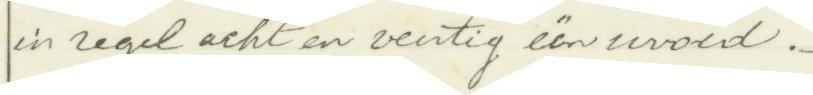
in regel acht en veertig een woord.
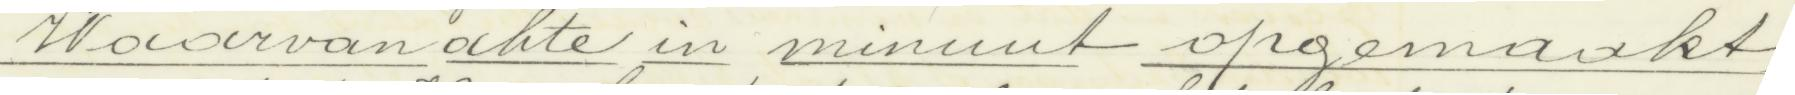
Waarvan akte in minuut opgemaakt
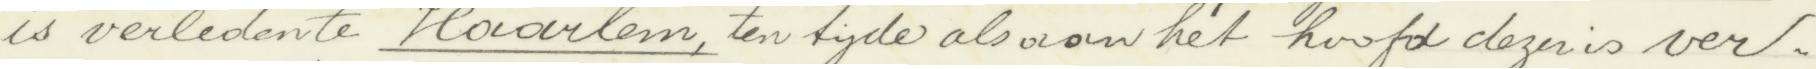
is verleden te Haarlem, ten tijde als aan het hoofd dezer is ver-
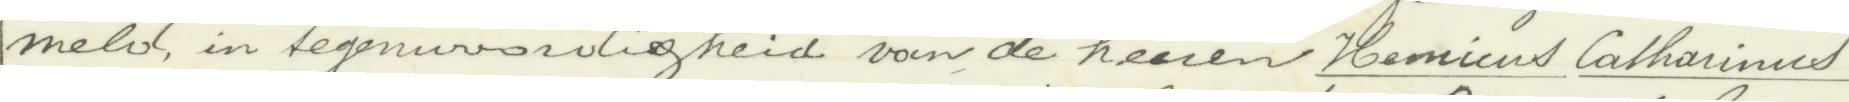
meld, in tegenwoordigheid van de heeren Henricus Catharinus
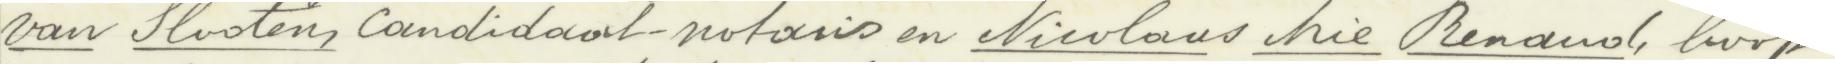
van Slooten, candidaat-notaris en Nicolaas Arie Renaud, koop-
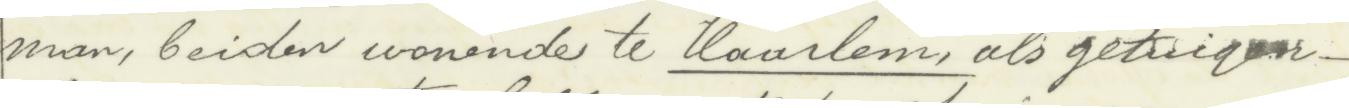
man, beiden wonende te Haarlem, als getuigen
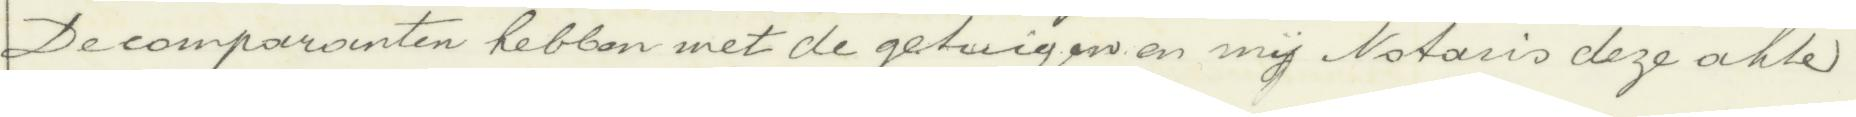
De comparanten hebben met de getuigen en mij Notaris deze akte
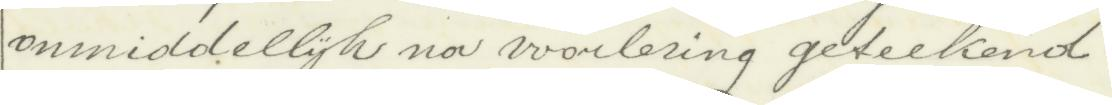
onmiddellijk na voorlezing geteekend
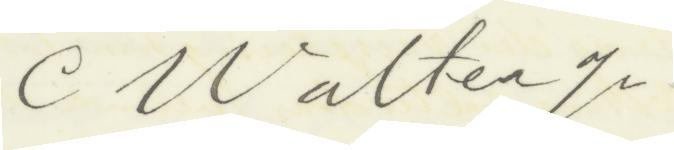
C Walter Jr
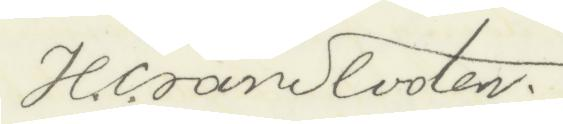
H.C.vanSlooten.
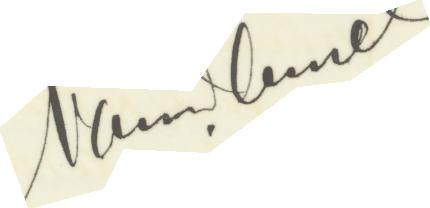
VanHamel
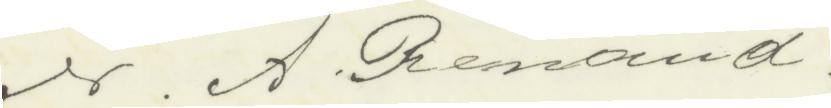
N. A. Renaud
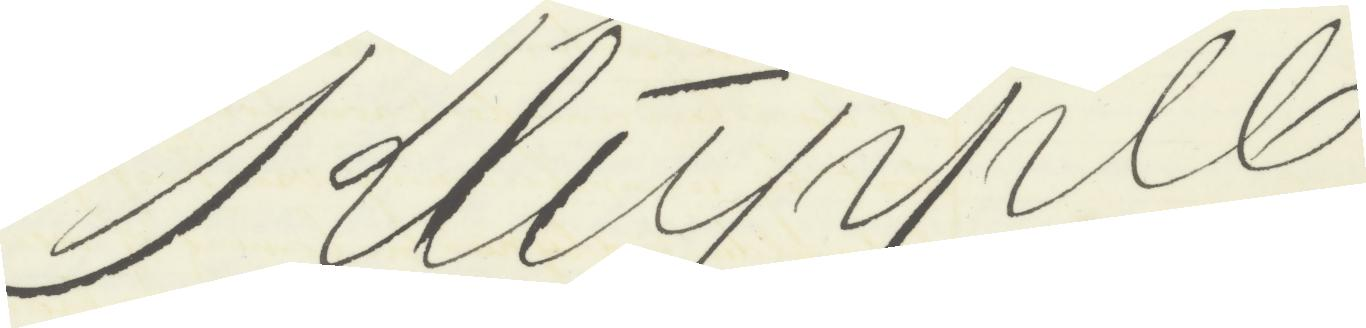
Kluppel
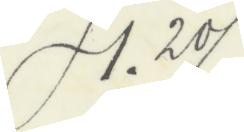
ƒ1.20/.
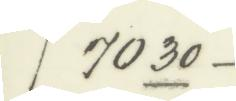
¶ 7030
